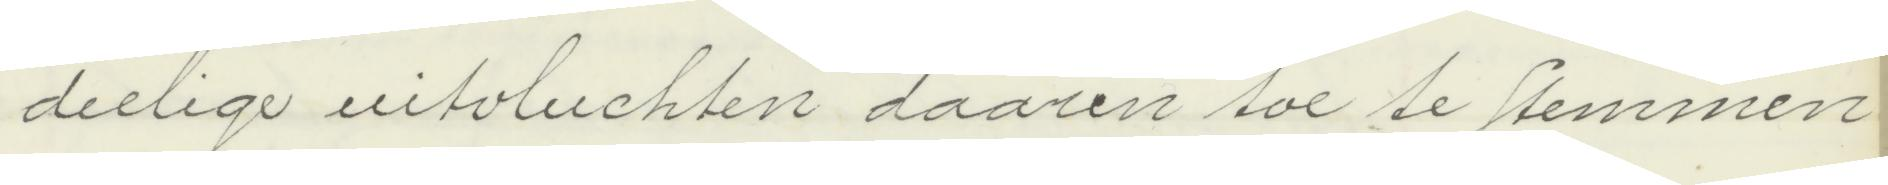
deelige uitvluchten daaren toe te stemmen
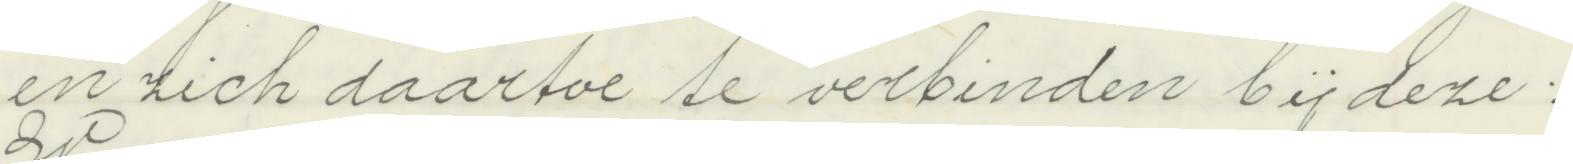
en zich daartoe te verbinden bij deze:
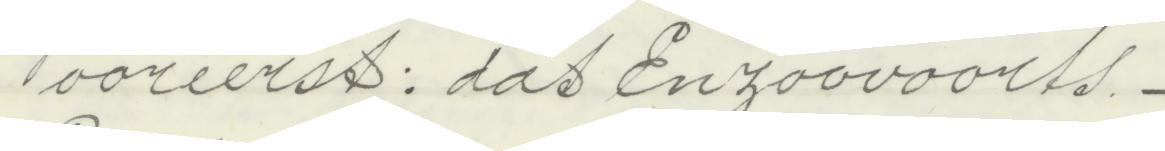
Vooreerst: dat Enzoovoorts.
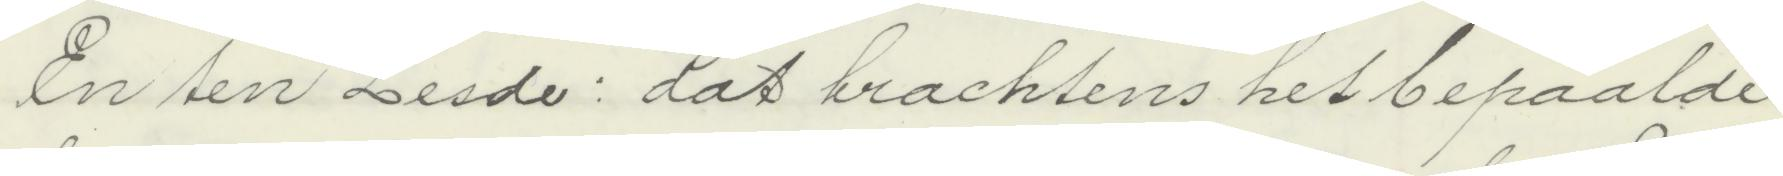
En ten Zesde: dat krachtens het bepaalde
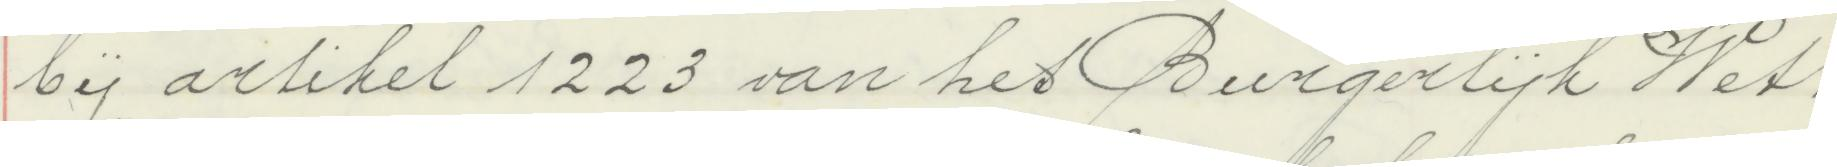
bij artikel 1223 van het Burgerlijk Wet„
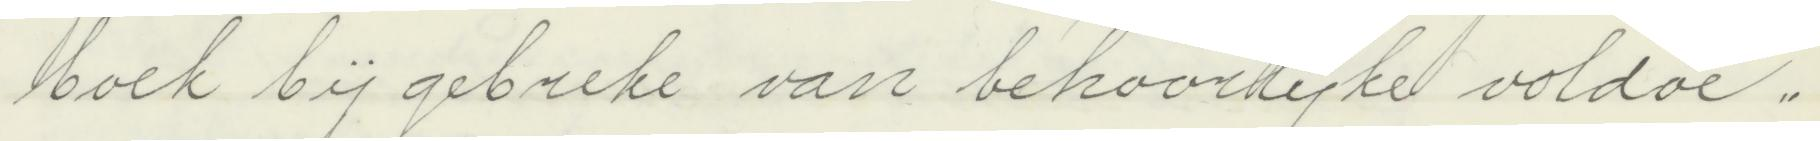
boek bij gebreke van behoorlijke voldoe„
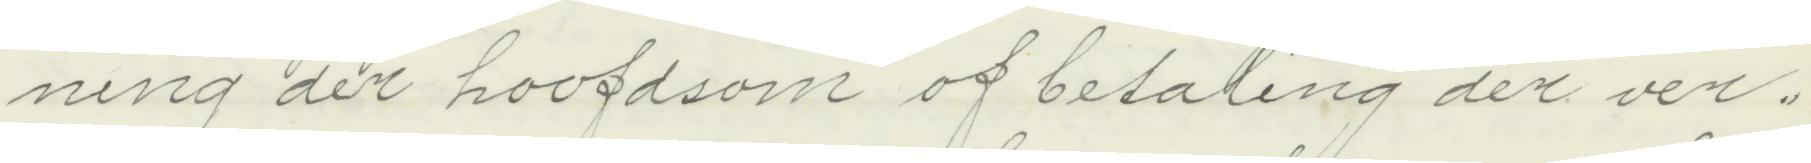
ning der hoofdsom of betaling der ver„
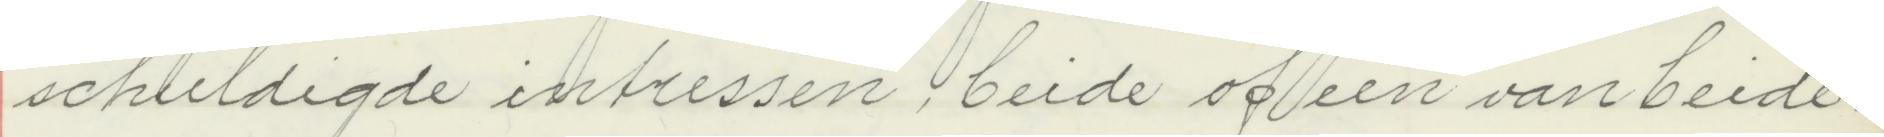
schuldigde intressen, beide of een van beide,
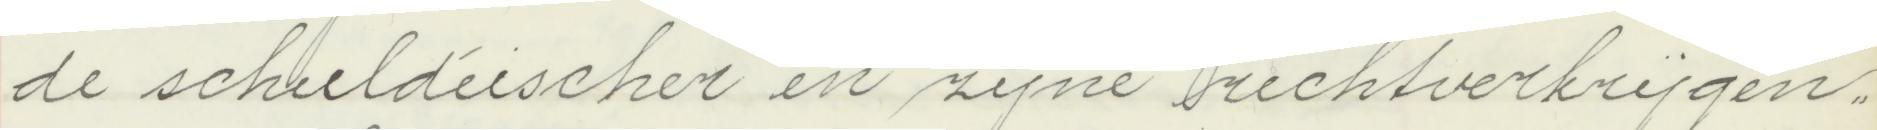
de schuldeischer en zijne rechtverkrijgen„
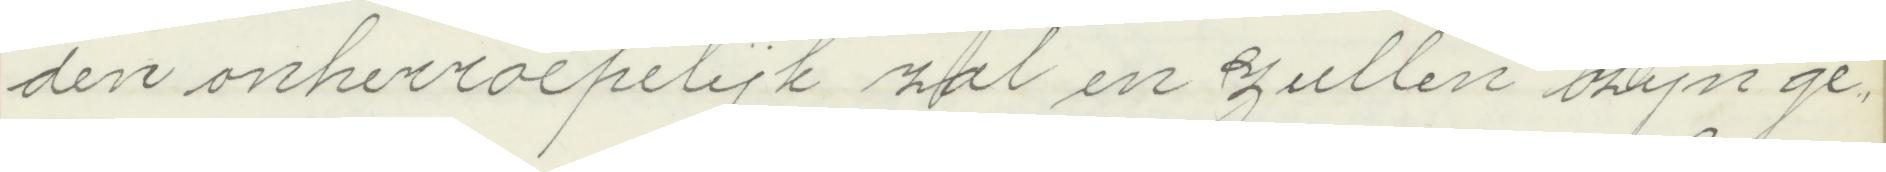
den onherroepelijk zal en zullen zijn ge„
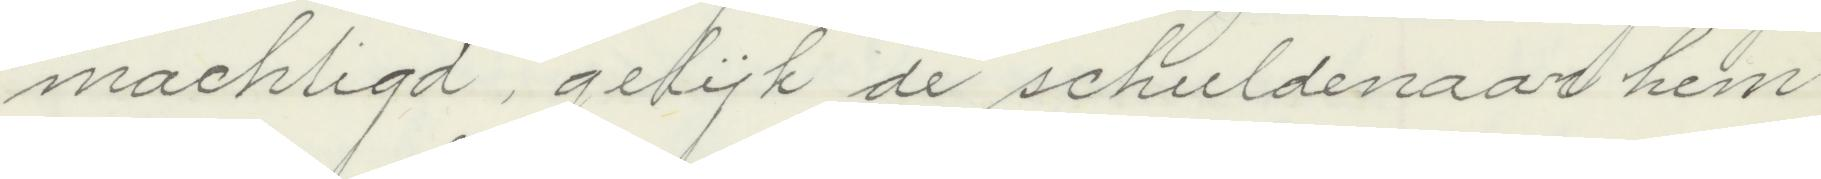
machtigd, gelijk de schuldenaar hem
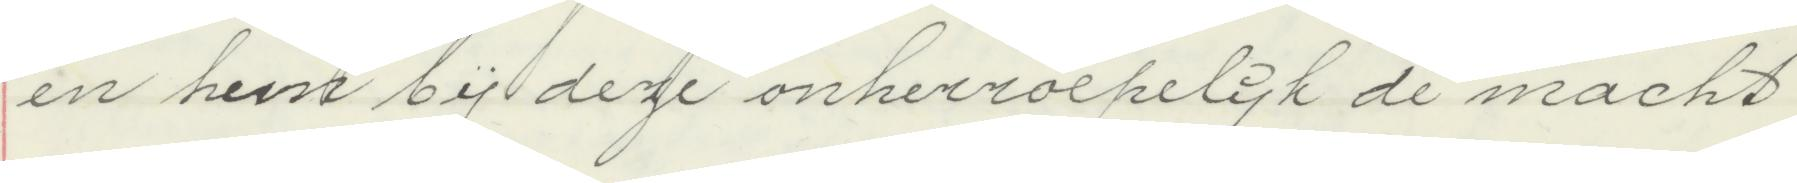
en hem bij deze onherroepelijk de macht
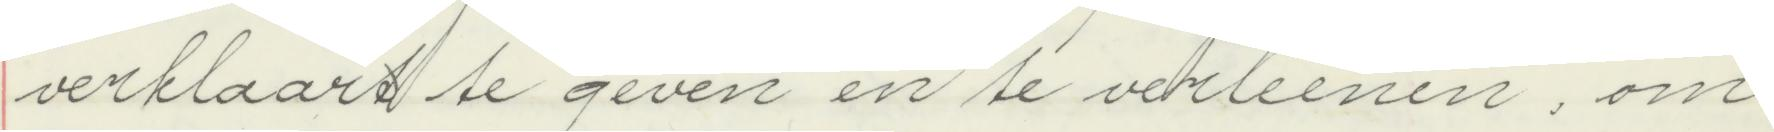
verklaart te geven en te verleenen, om
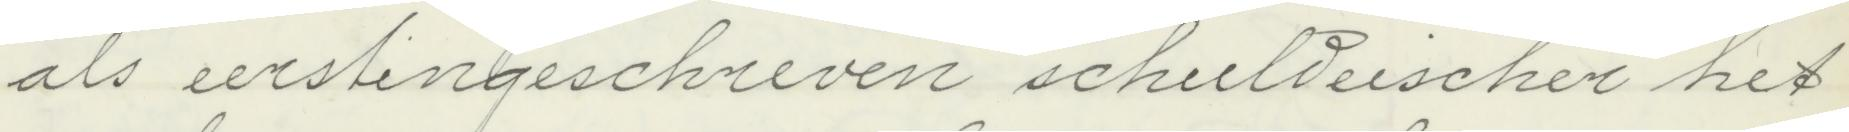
als eerstingeschreven schuldeischer het
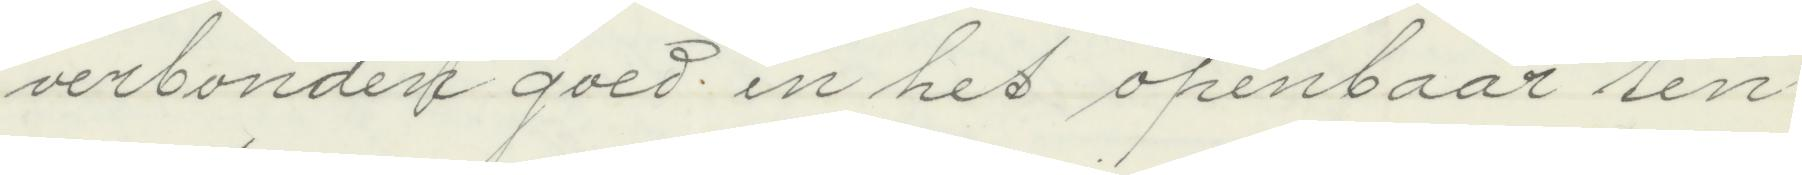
verbonden goed in het openbaar ten
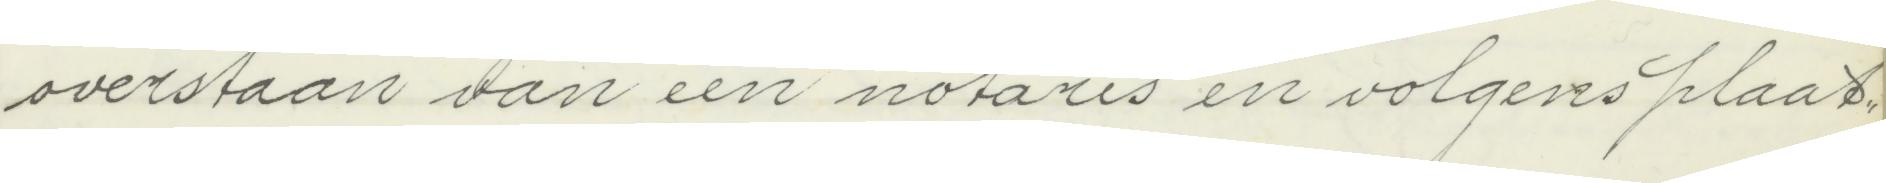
overstaan van een notaris en volgens plaat„
